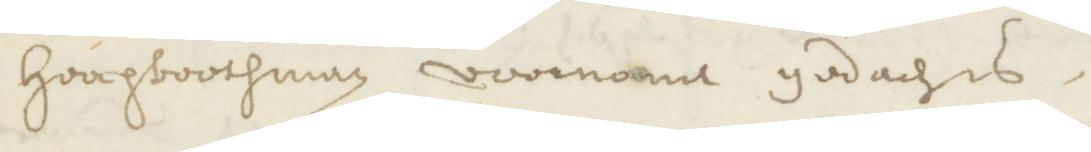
hoochbootsman voornoemt gedaen is,
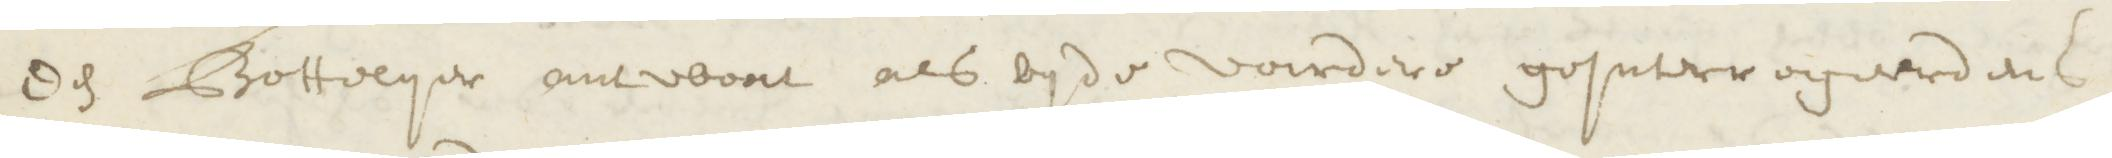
den Bottelyer antwoort als by de voirdere gejnterrogeerdens
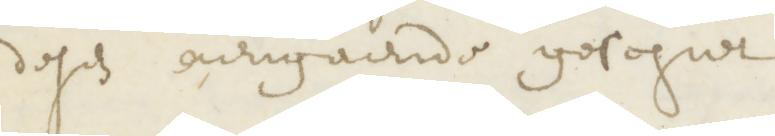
desen aengaende geschiet
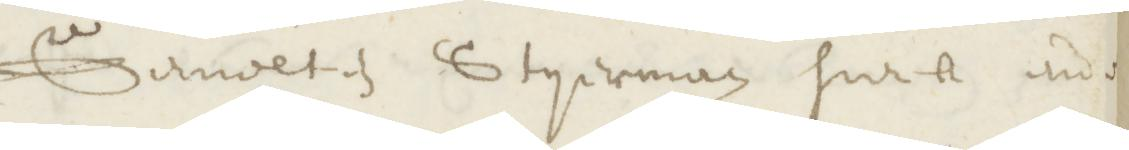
Gemelten styerman sterft ende
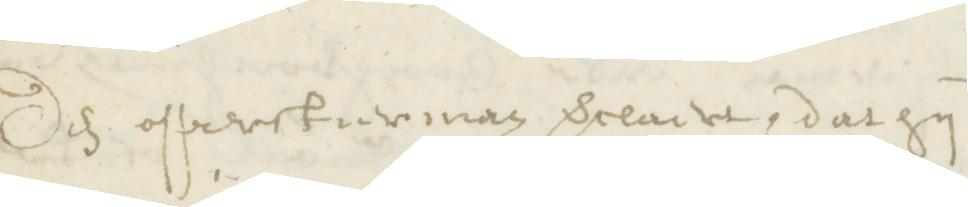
Den opperstierman verclaert, dat hy
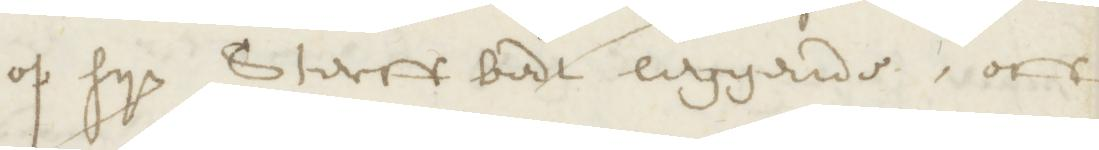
op syn Sterffbedt leggende, off
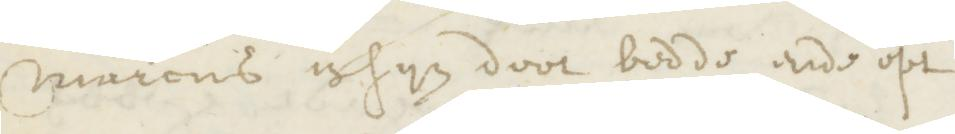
marcus in syn doot bedde ende opt
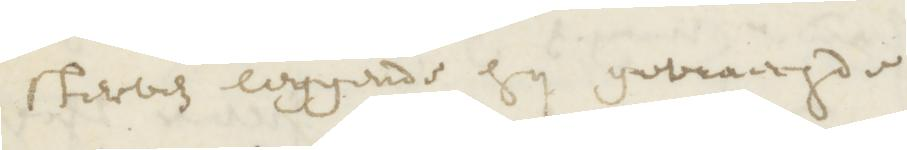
sterven leggende hy gevraechde
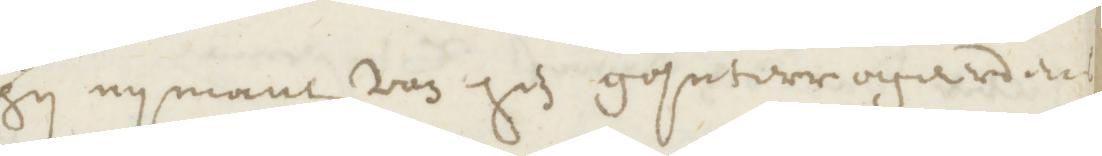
hy nymant van hen gejnterrogeerd en
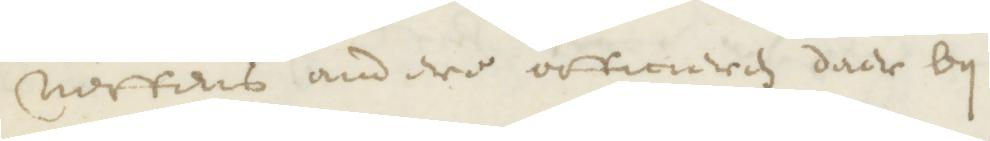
neffens andere officieren daer by
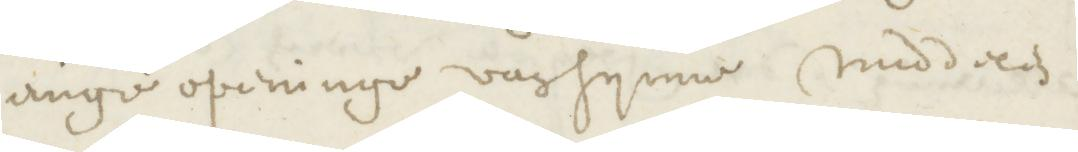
enge openinge van synne middelen
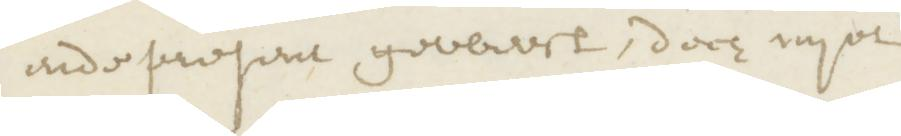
ende present geweest, doch nyet
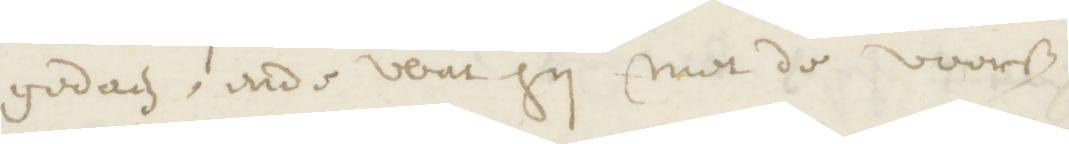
gedaen, ende wat hy met de voorsz
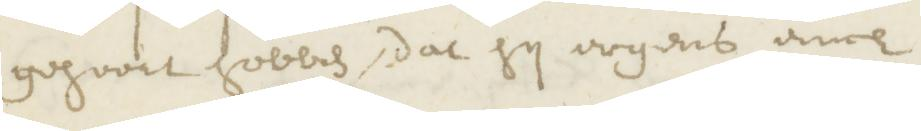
gehoort hebben, dat hy ergens enich
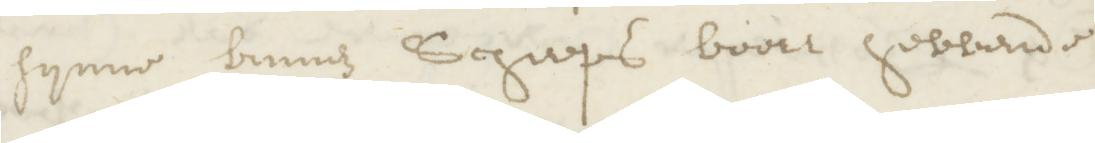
synne binnen scheeps boort hebbende
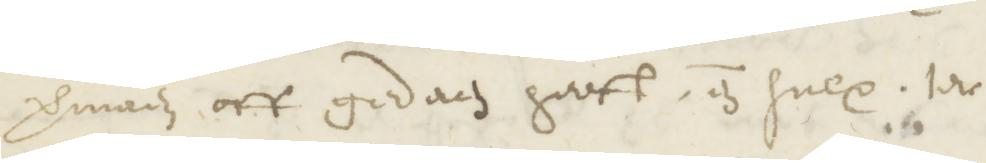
vermaen off gedaen heeft, ende sulx . ter
